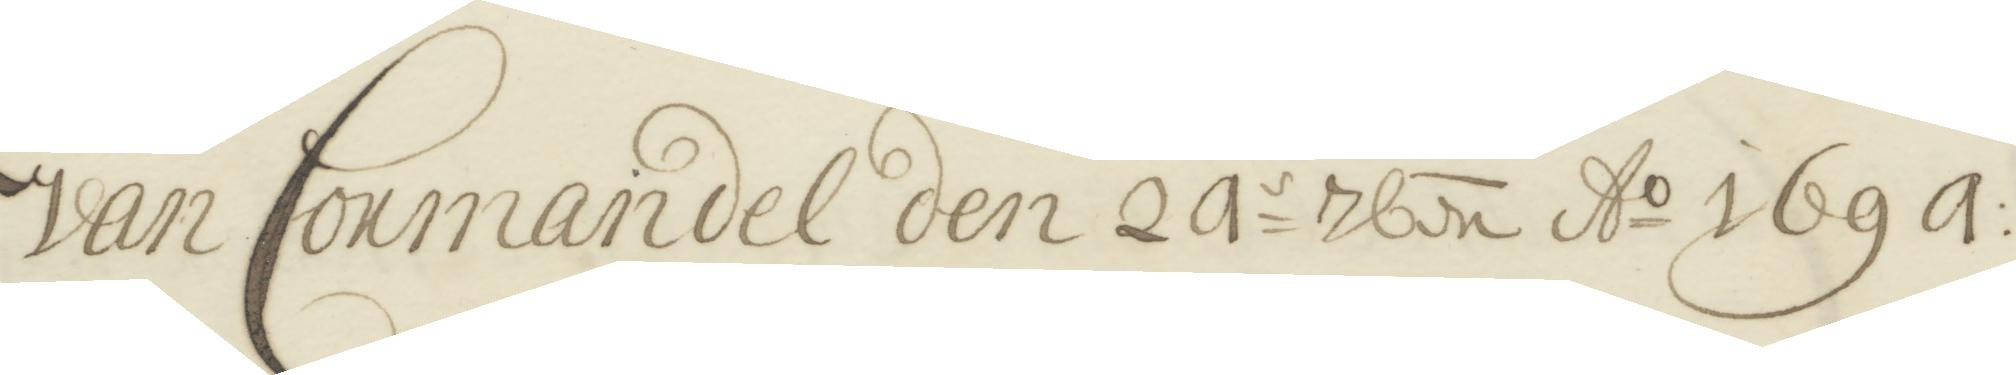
van Cormandel den 24=' 7ber A=o 1694:
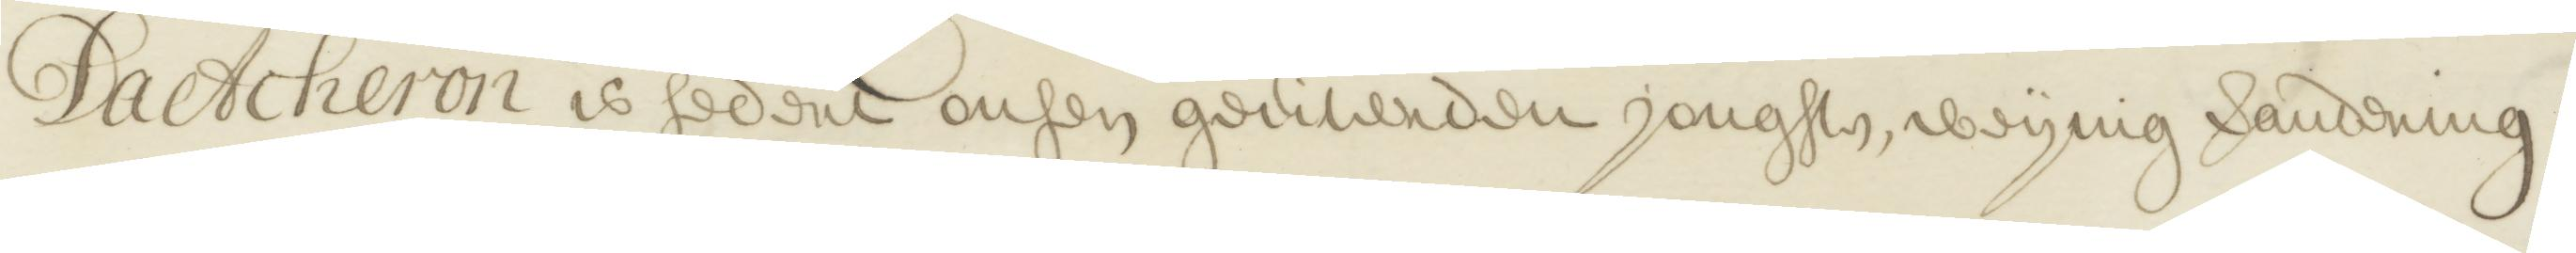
Daetcheron is sedert onsen geeiterden jongsten, weijnig verandering,
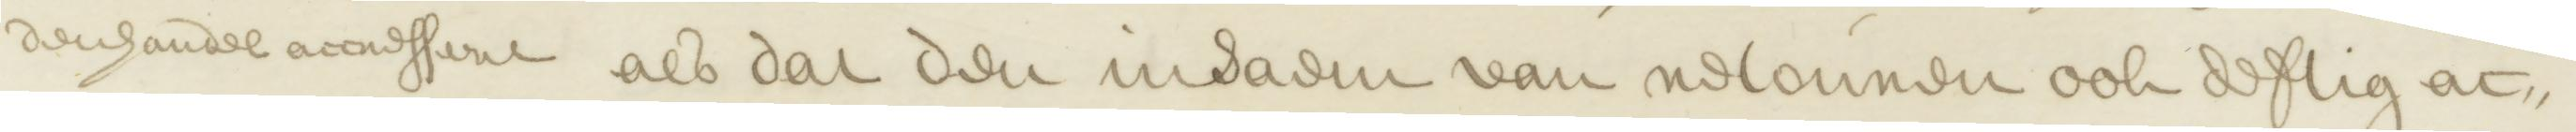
den handel accresseert als dat den insaem van retouren ook deftig ac„
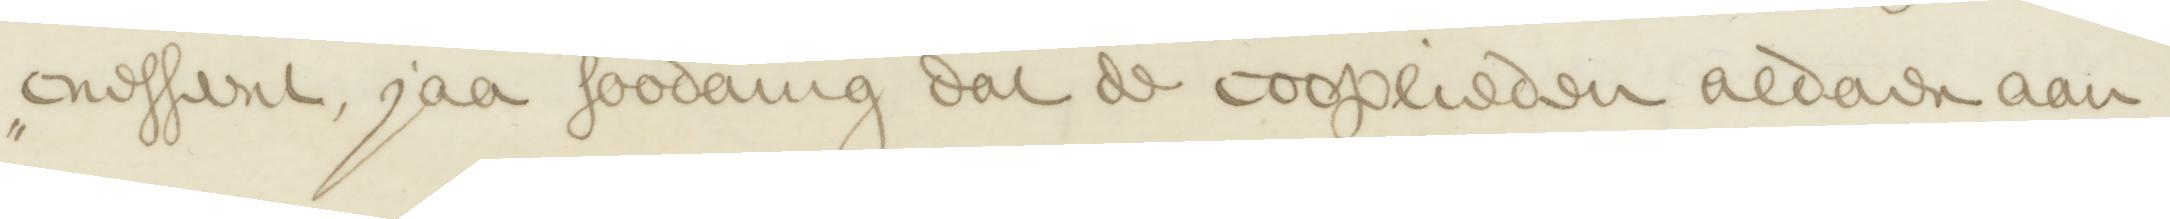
„cresseert, jaa soodanig dat de cooplieden aldaer aan
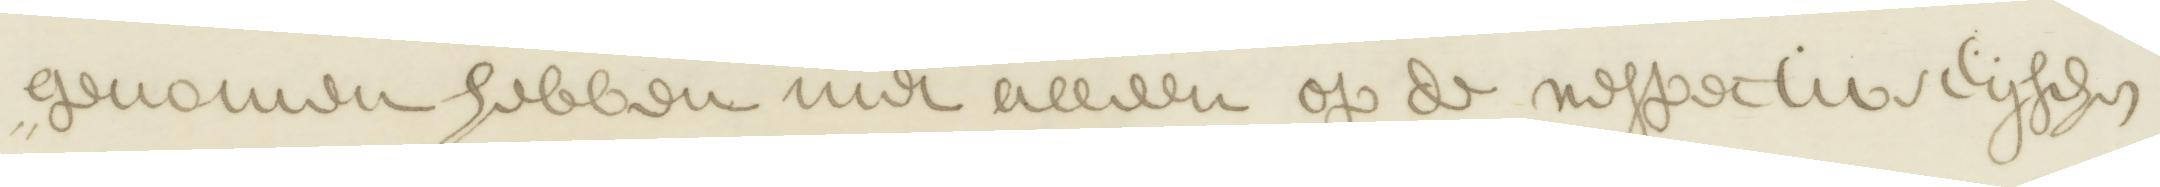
„genomen hebben niet alleen op de respective Eijschen
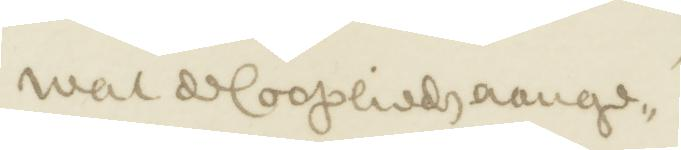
wat de Cooplieden aange„
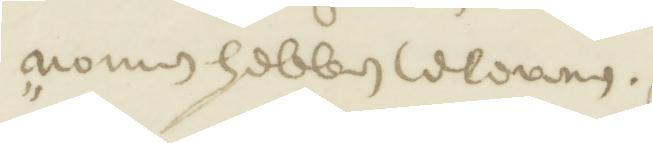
„nomen hebben te leveren.
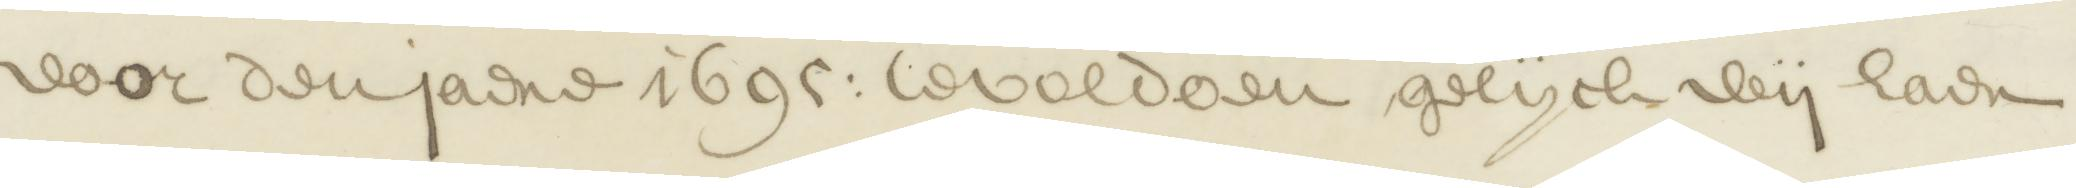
voor den jaere 1695: tevoldoen gelijck wij haer
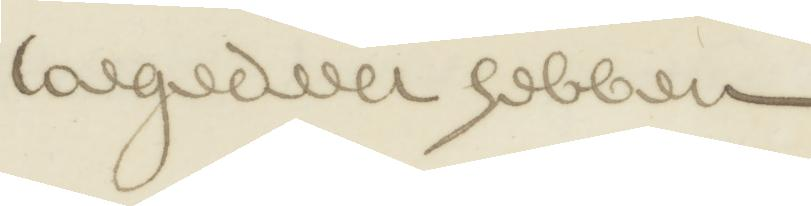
toegedeelt hebben
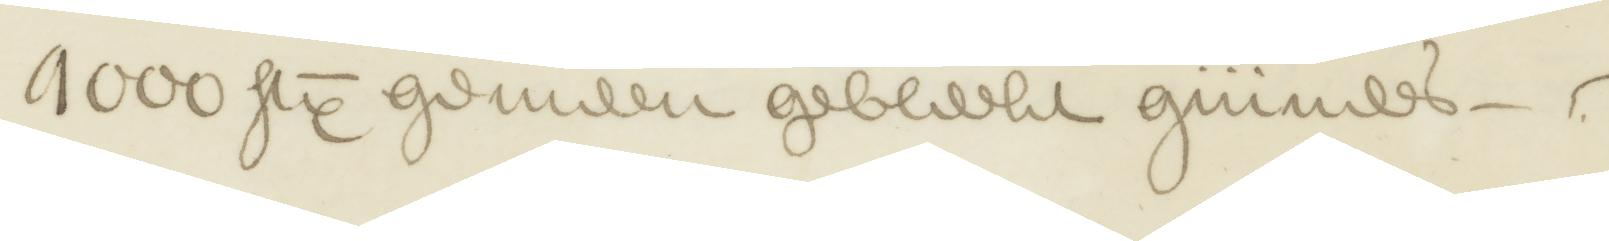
4000 stx gemeen gebleekt guinees -.
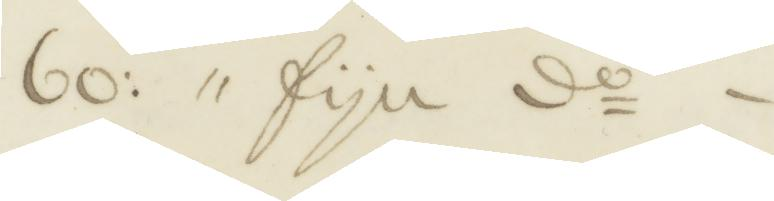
60: „ fijn d=o -
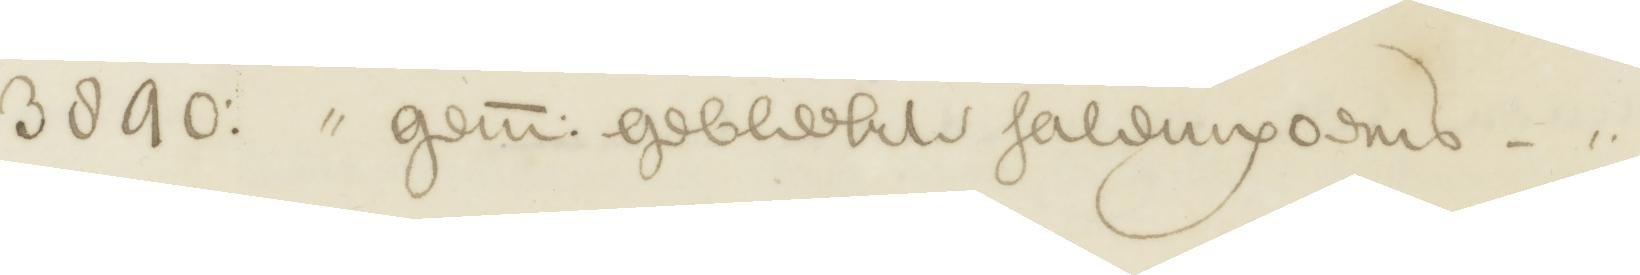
3840: „ gem: gebleekte salempoeris - „
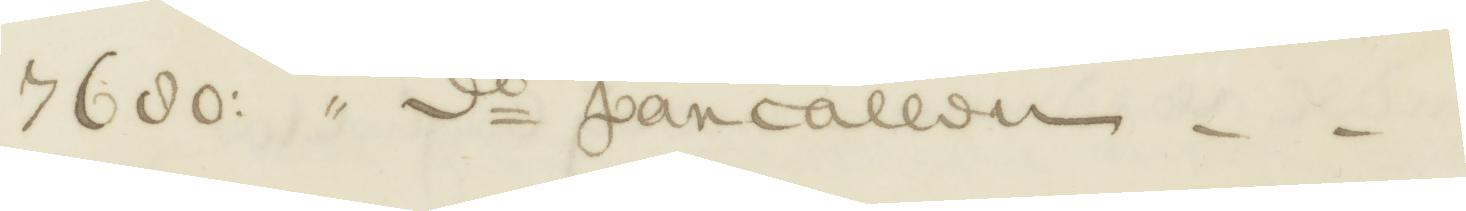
7680: „ d=o parcallen - -
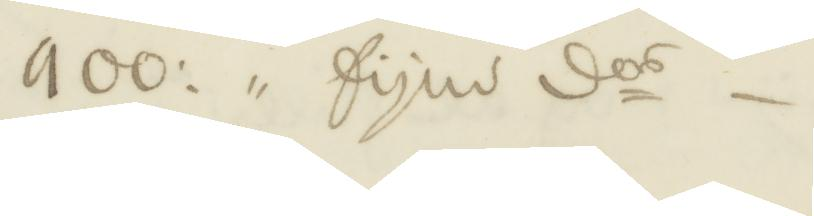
400: „ fijne d=os -
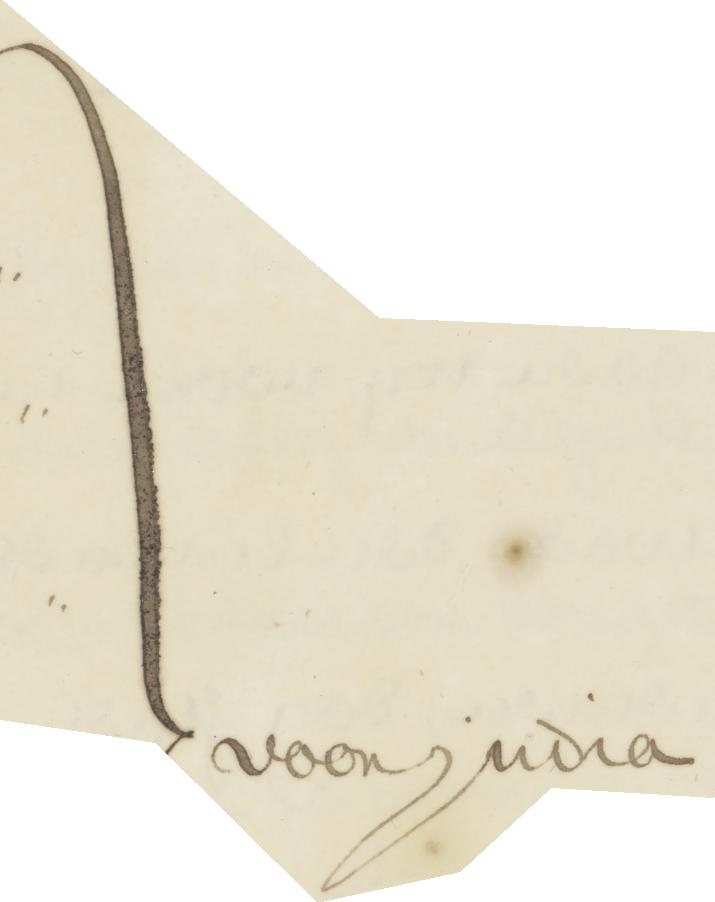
voor jndia
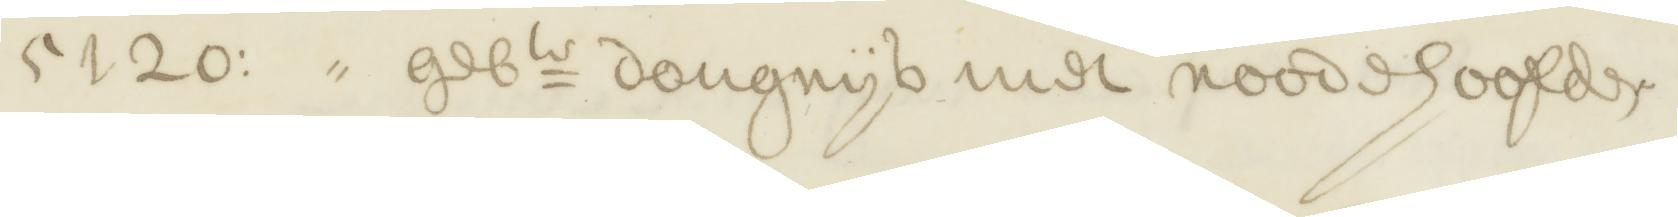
5120: „ geb=te dongrijs met roodehoofden
